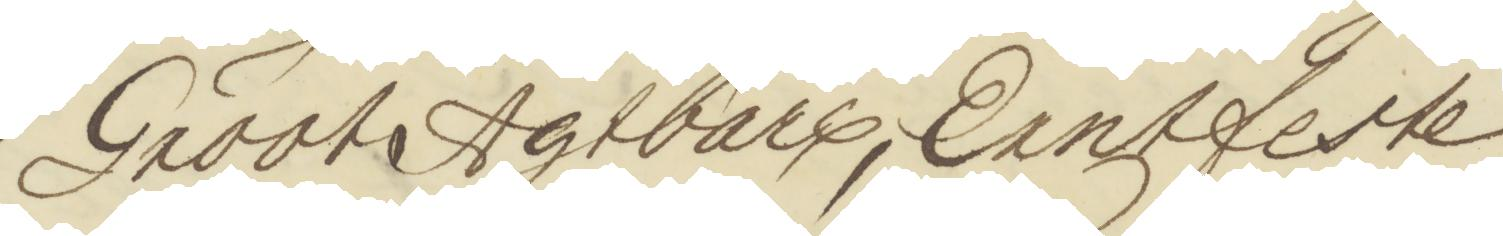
Groot Agtbare, Erntfeste
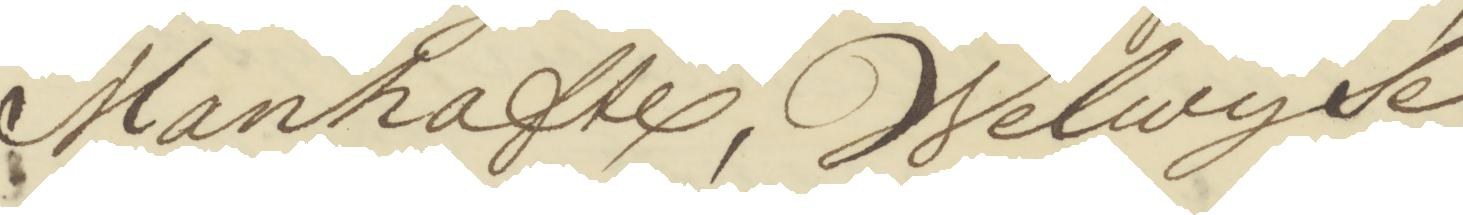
Manhafte, Welwijse
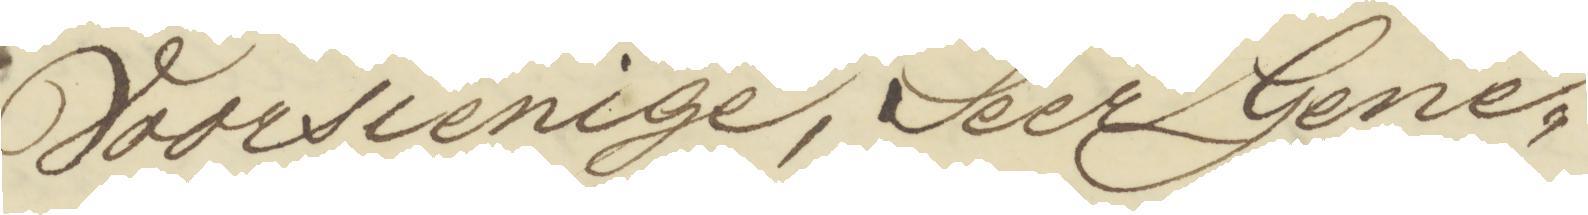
Voorsienige, seer Gene„
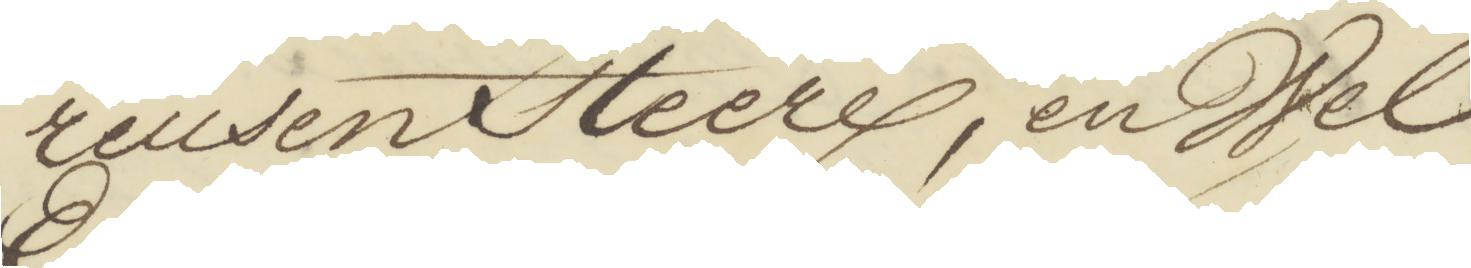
reusen Heere, en Wel
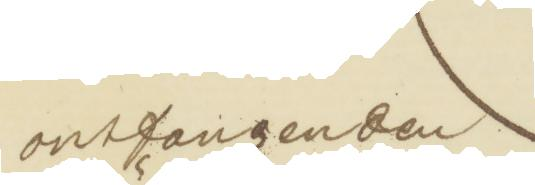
ontfangen den
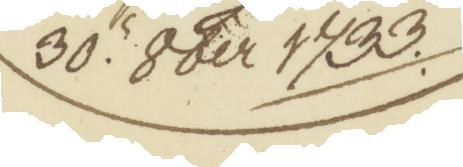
30.' 8ber 1733.
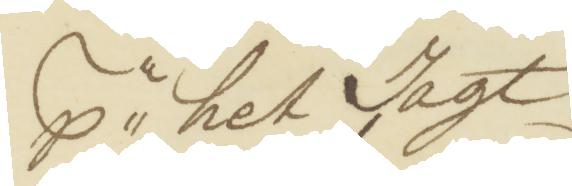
p„r het Iagt
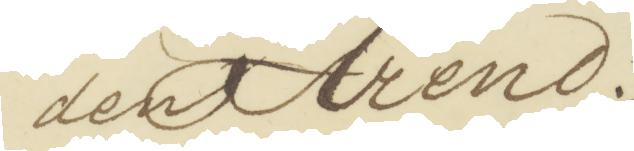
den Arend.
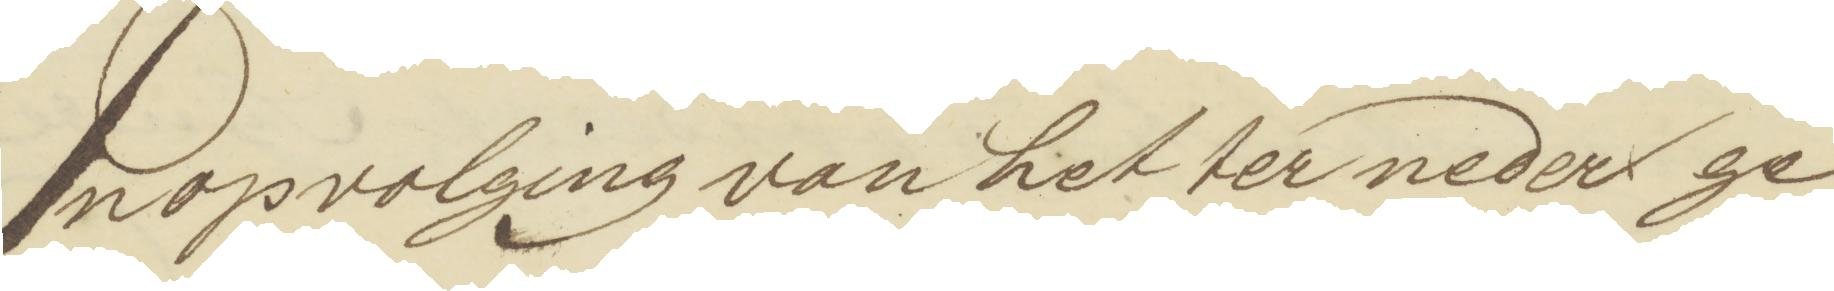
In opvolging van het ter neder ge
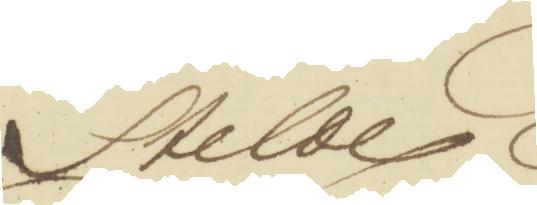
stelde
